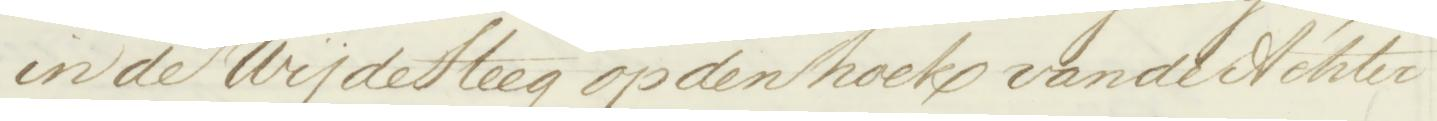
in de Wijdesteeg op den hoek van de Achter
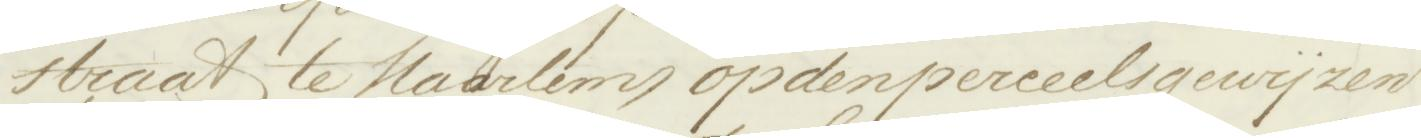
straat te Haarlem, op den perceels gewijzen
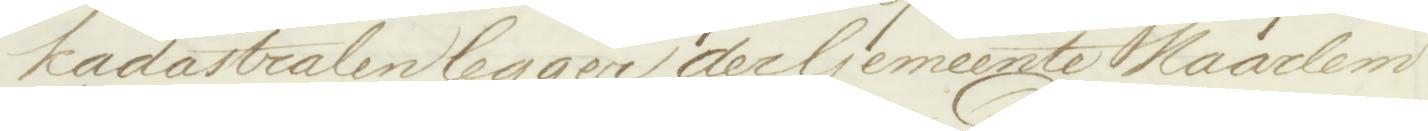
kadastralen legger der Gemeente Haarlem
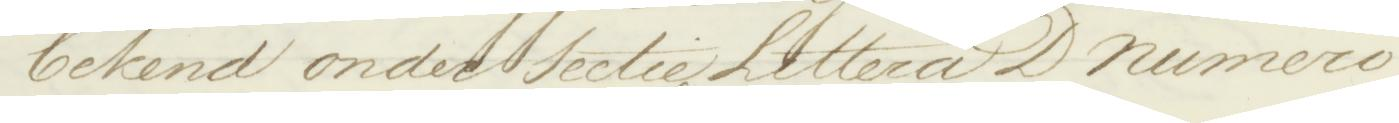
bekend onder sectie Lettera D Numero
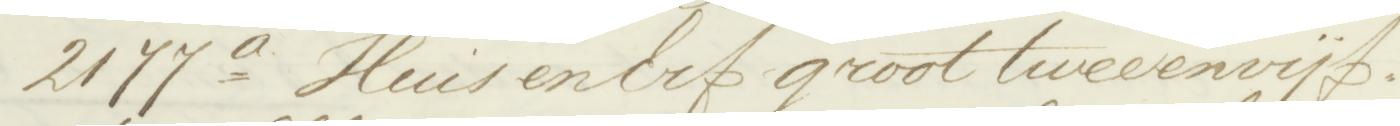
2177=o Huis en Erf groot twee en vijf„
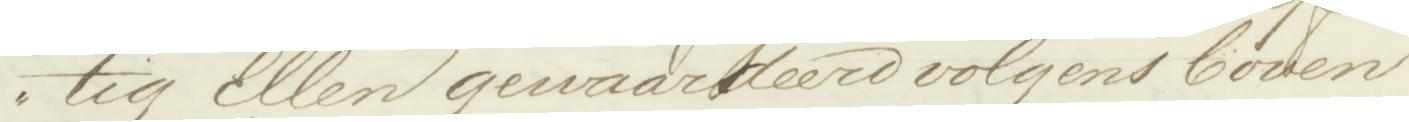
„ tig Ellen gewaardeerd volgens boven
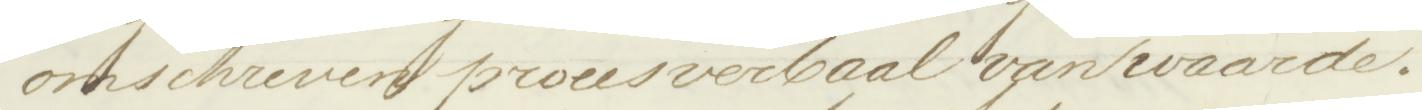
omschreven proces verbaal van waarde„
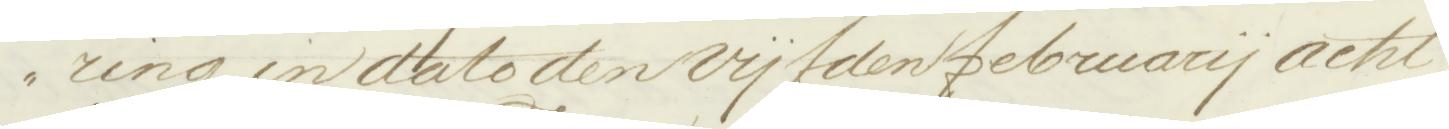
„ ring in dato den vijfden februarij acht
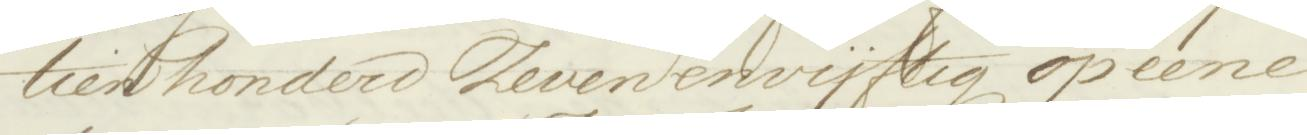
tien honderd Zeven envijftig op eene
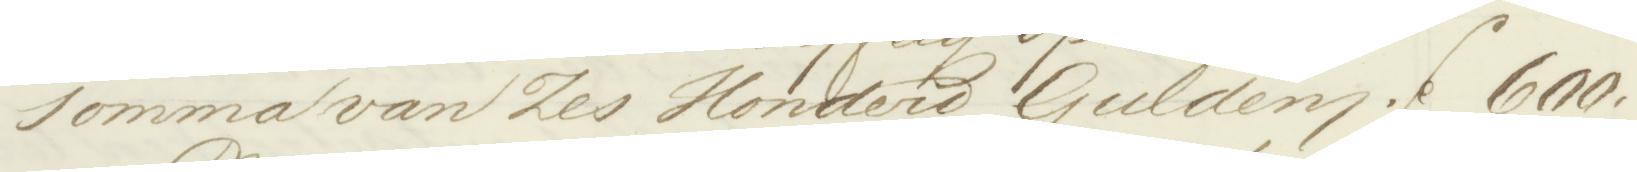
somma van Zes Honderd Guldens. ƒ 600.
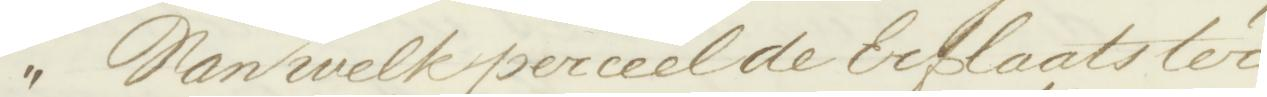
„ Van welk perceel de Erflaatster
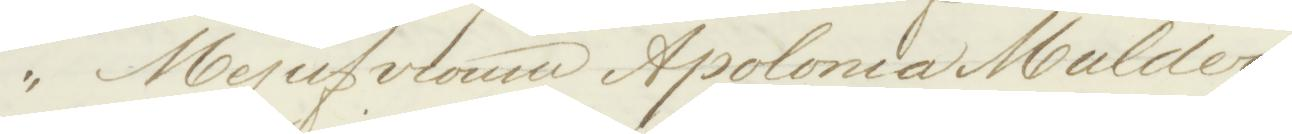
„ Mejufvrouw Apolonia Mulder
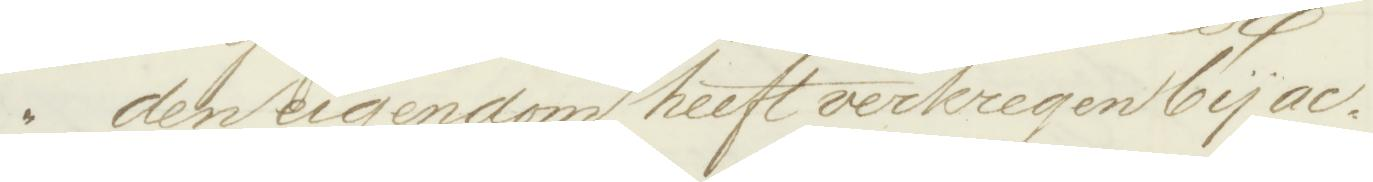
„ den eigendom heeft verkregen bij ac„
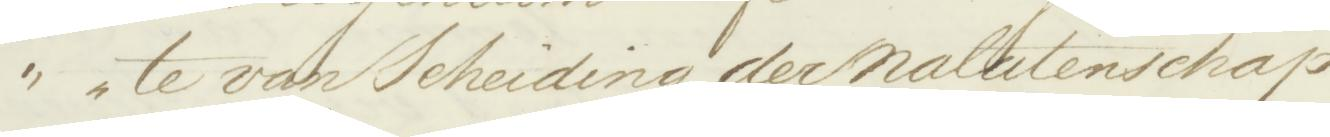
„ „te van scheiding der nalatenschap
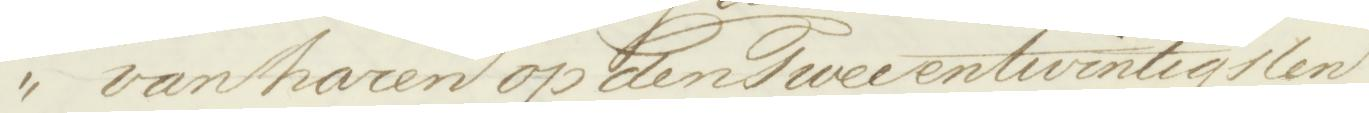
„ van haren op den Twee en twintigsten
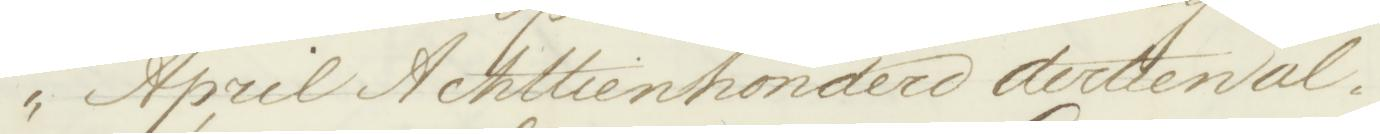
„ April Achttienhonderd dertien al„
